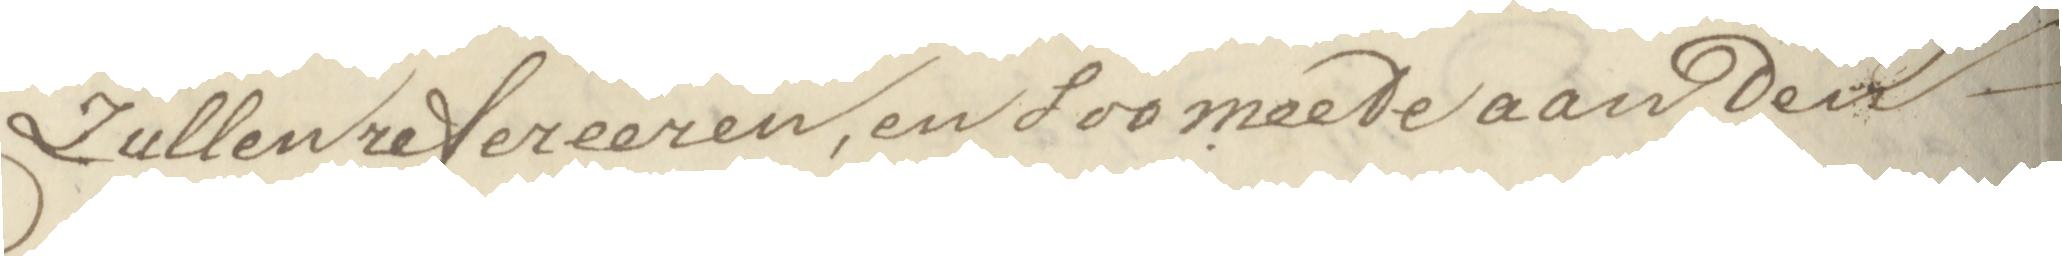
zullen refereeren, en soo meede aan den —
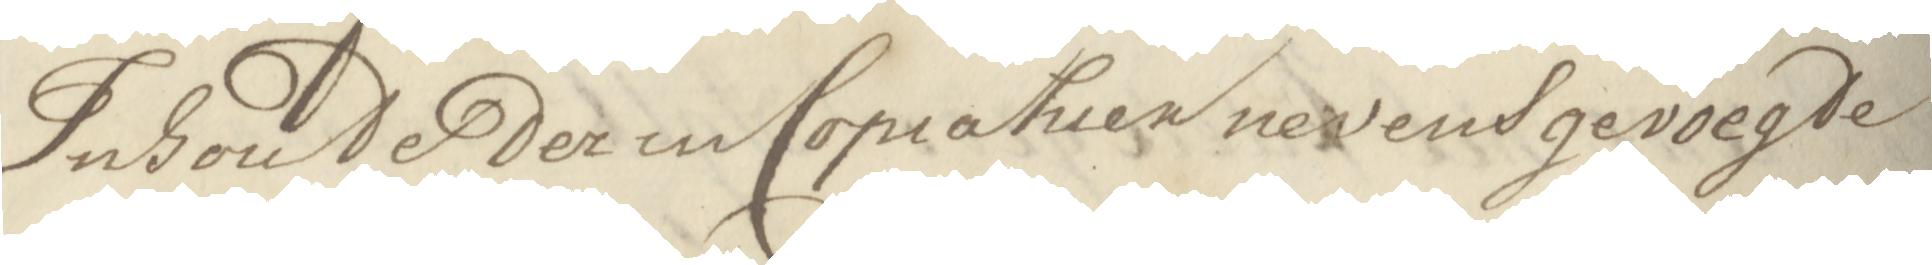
Inhoude der in Copia hier nevens gevoegde
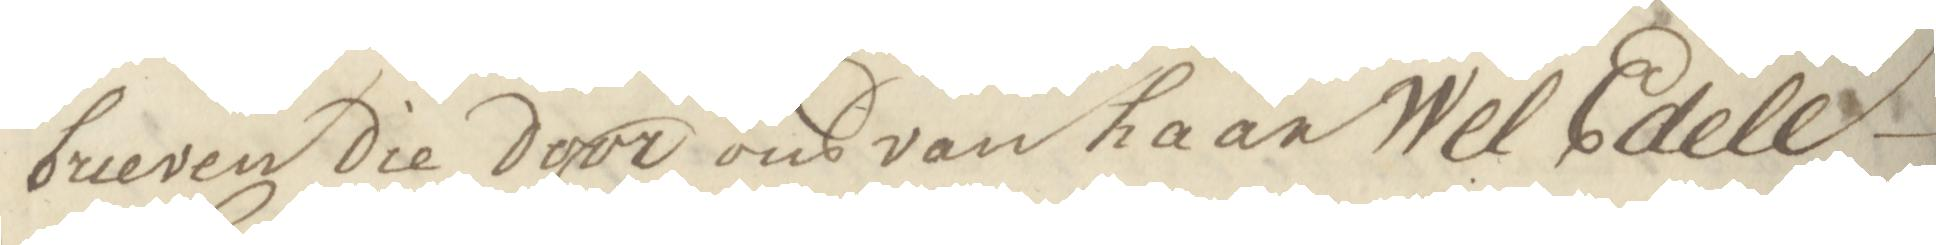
brieven die door ons van haar Wel Edele —
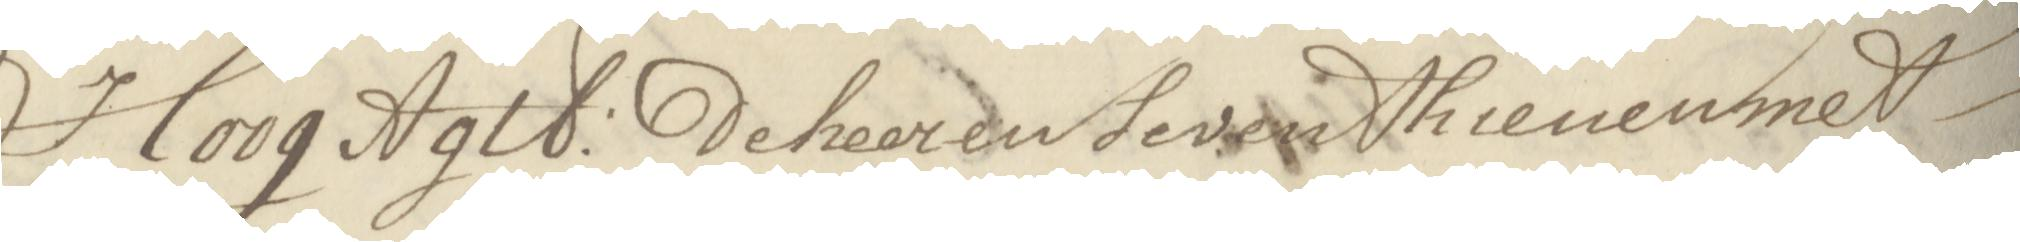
Hoog Agtb: de heeren seventhienen met —
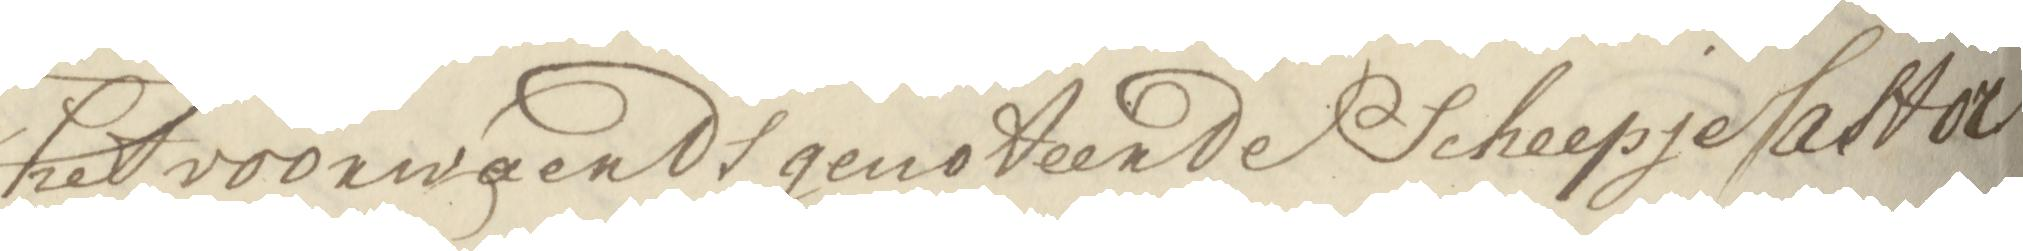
het voorwaerds genoteerde scheepje Castor
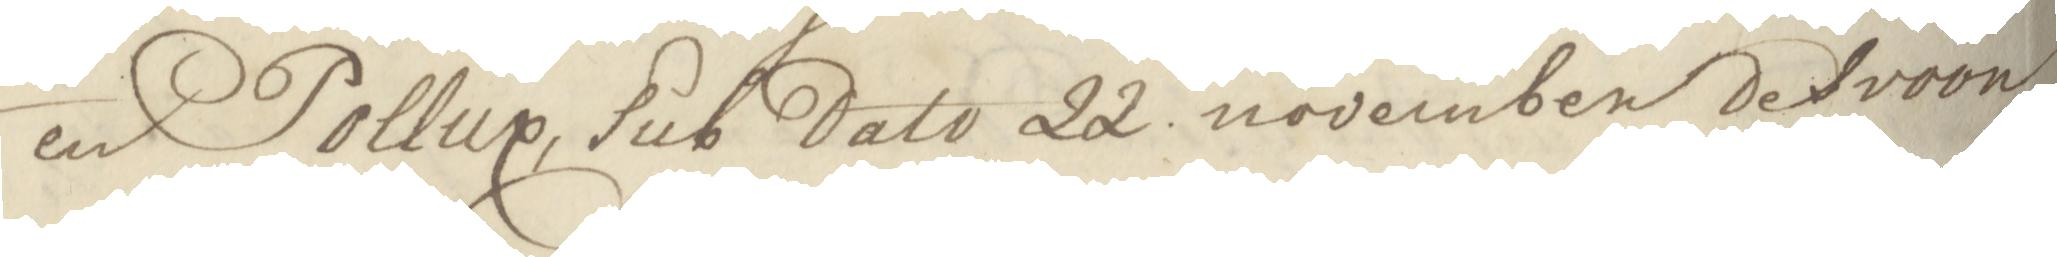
en Pollux, sub dato 22:' november des voor
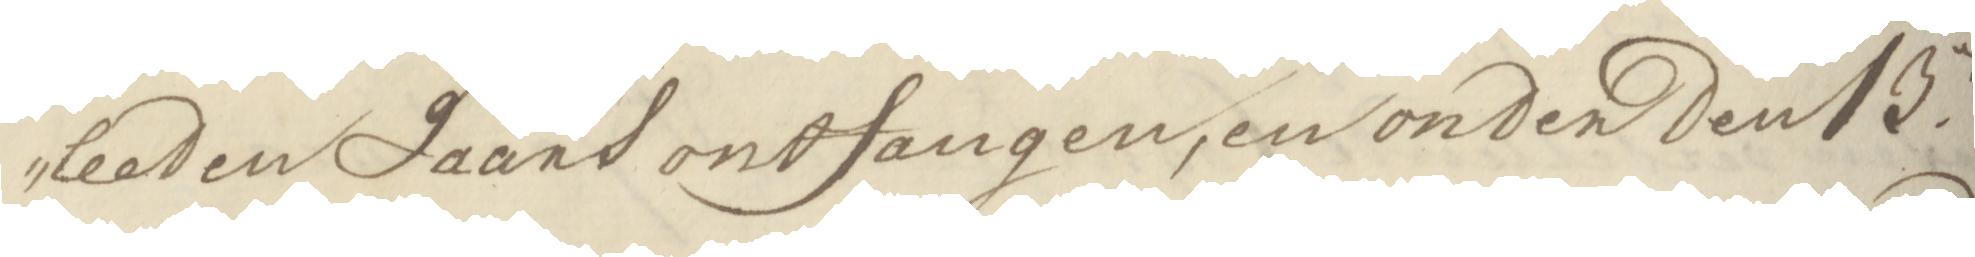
„leeden Iaars ontfangen, en onder den 13:
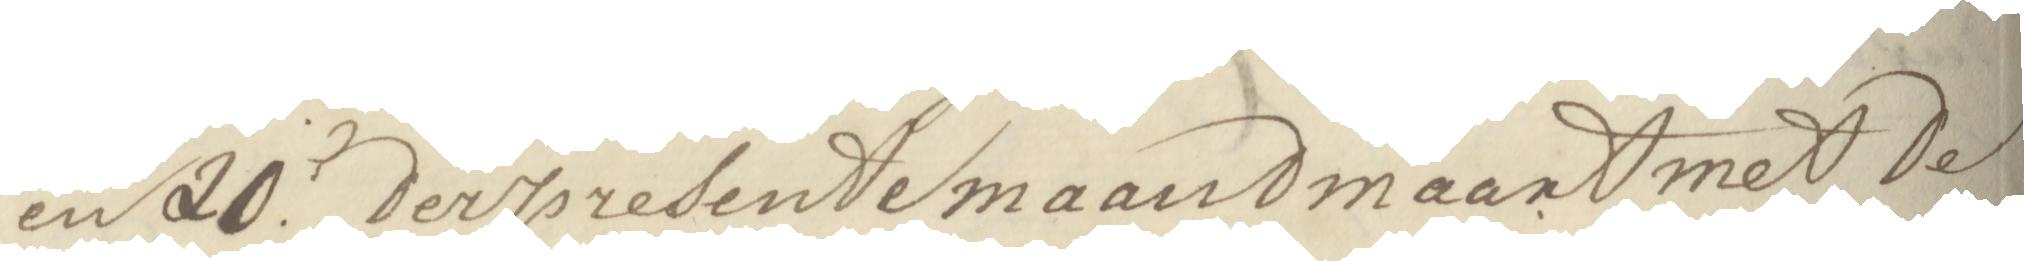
en 20:' der presente maand maart met de
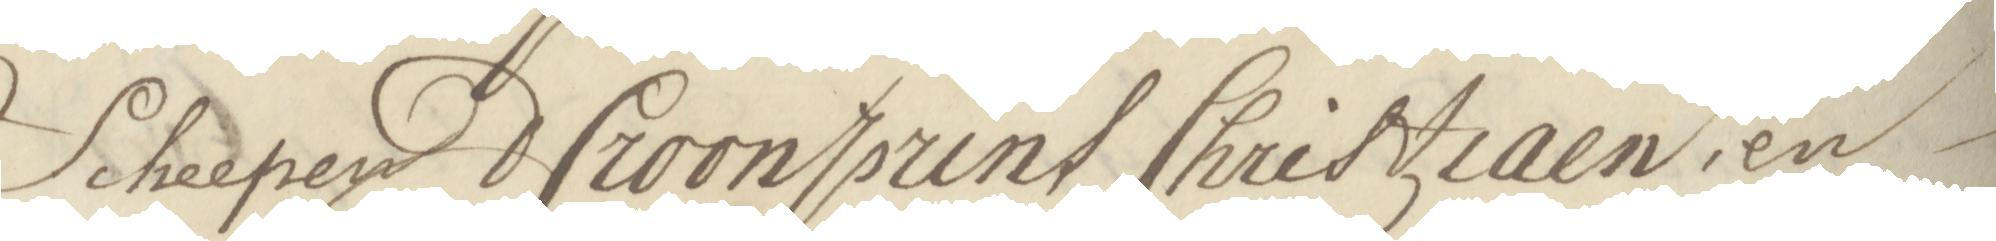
scheepen d Croonprins Christiaen, en
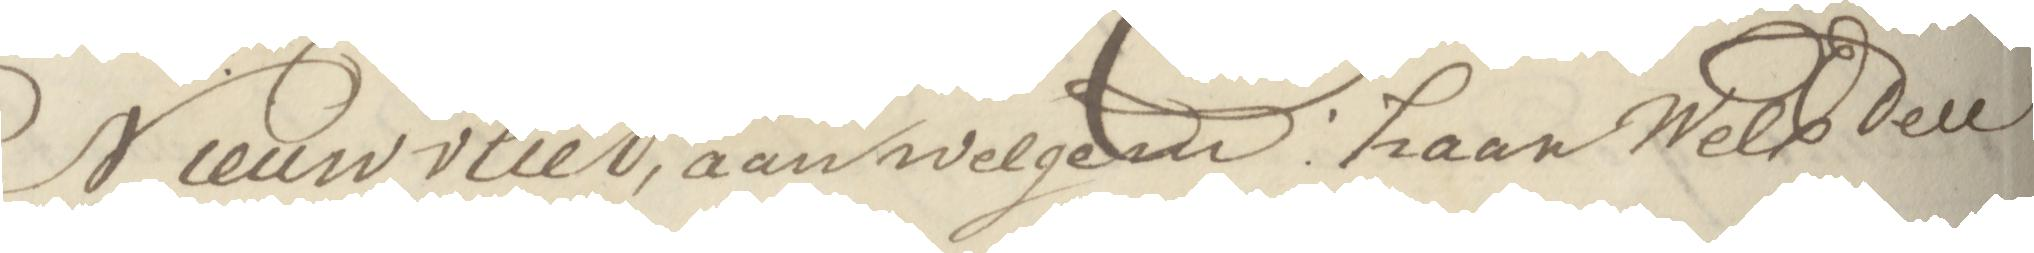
Nieuw vlied, aan welgem: haar wel Edele
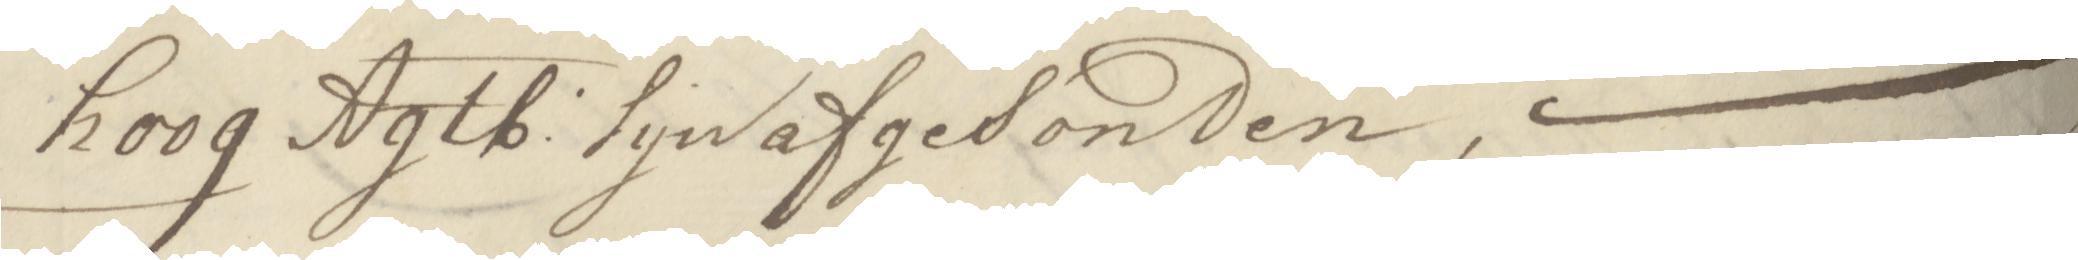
hoog Agtb: sijn afgesonden, —
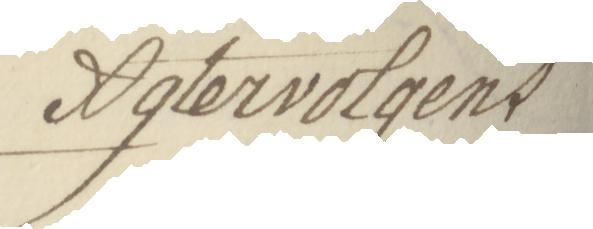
Agtervolgens
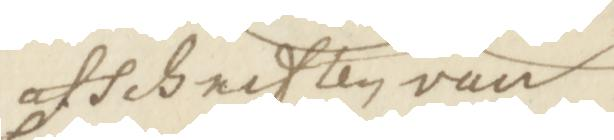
afschriften van
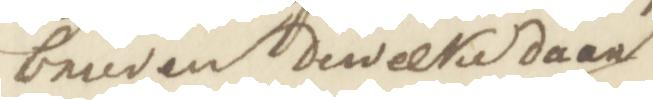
brieven dewelke daar
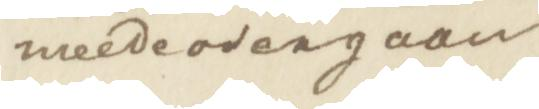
meede overgaan
